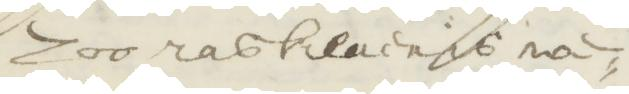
zoo ras klaer is we„
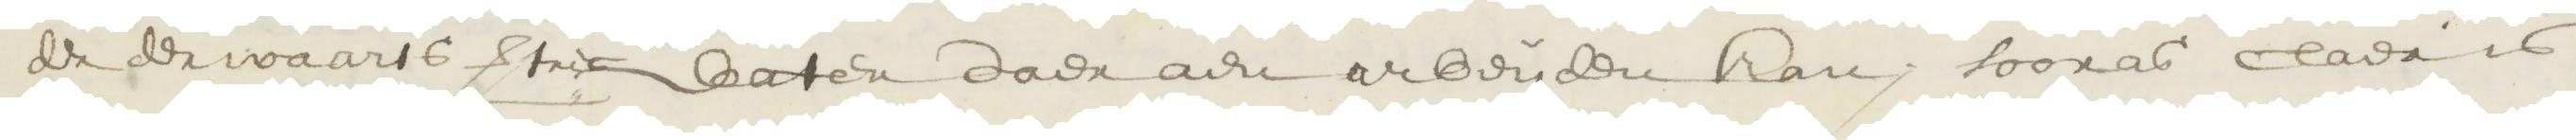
der der waarts vertrec„ water daer aen arbeijden kan; soo ras claer is
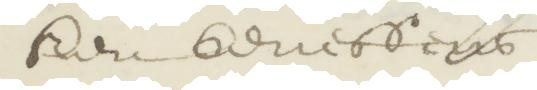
ken beneffens
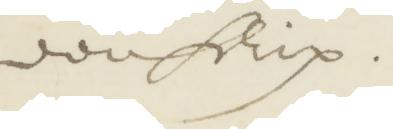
een schip.
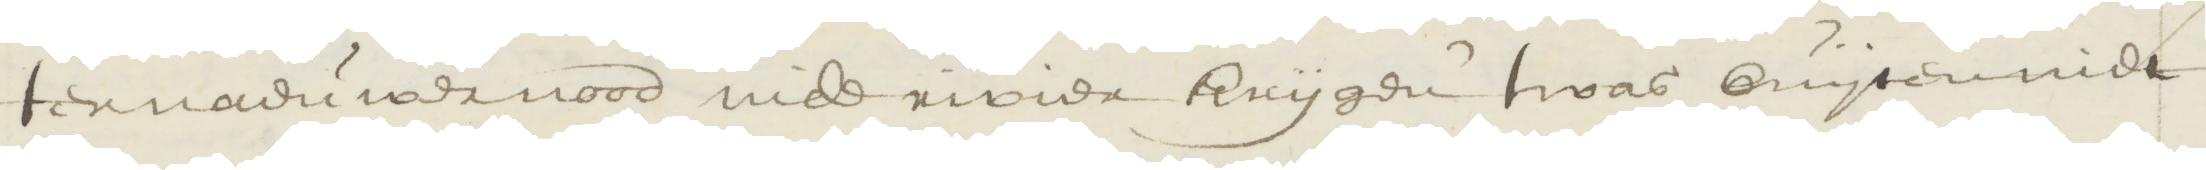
ternaeuwernood inde rivier krijgen 'twas buijten niet
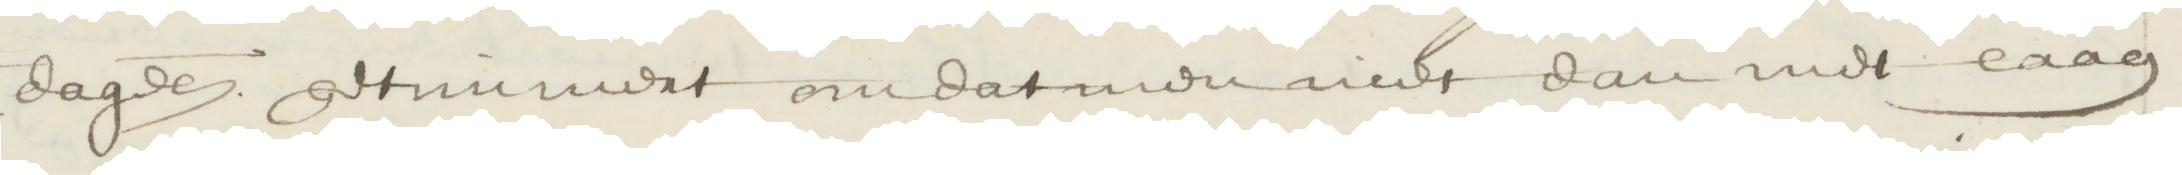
dagelijk getimmert om dat men niet dan met laag
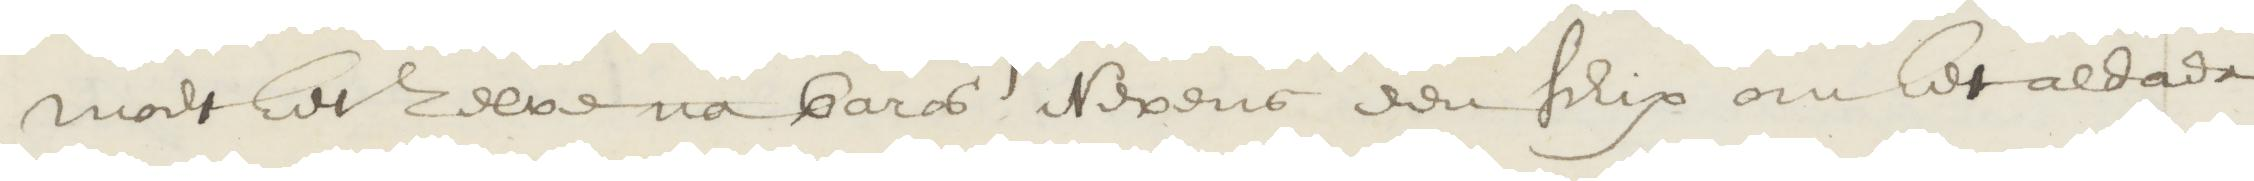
moet het Zelve na baros Nevens een schip om het aldaer
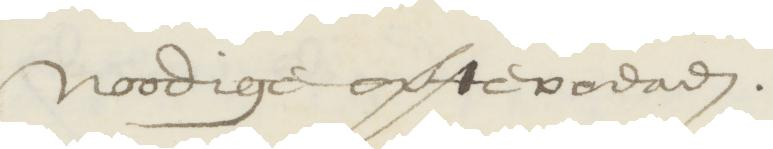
noodige oftevoeren.
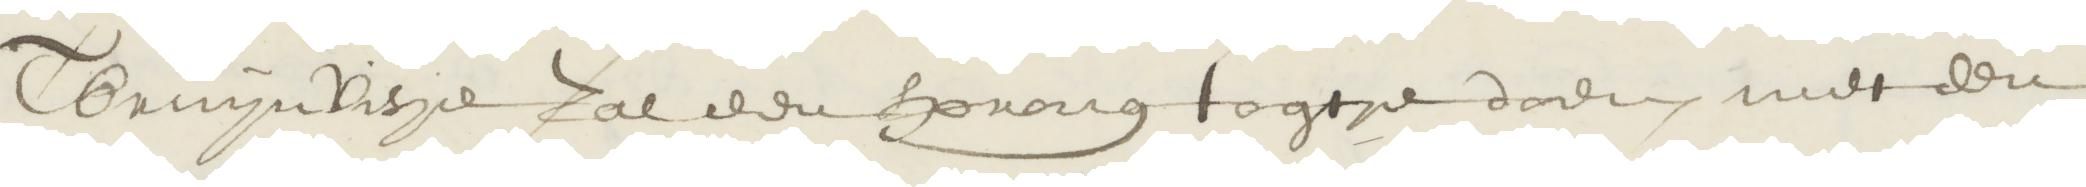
TBruijnVisje Zal een sprong togtje doen met den
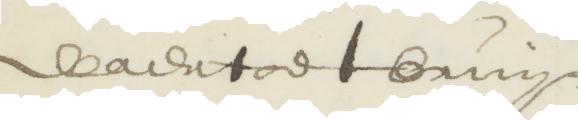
Waertoe t bruijn
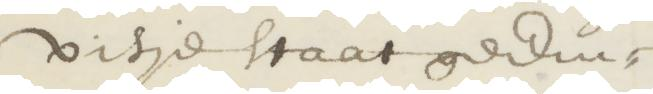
visje staat geEm„
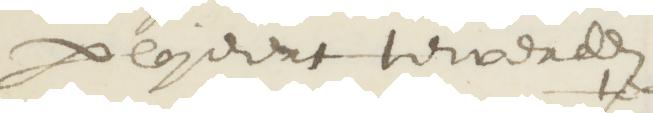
plojeert tewerden
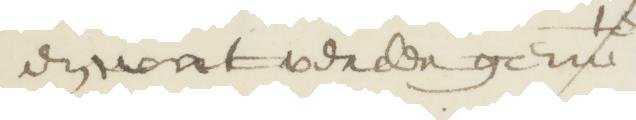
en wat verder gem:te
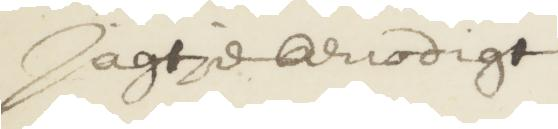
jagtje benodigt
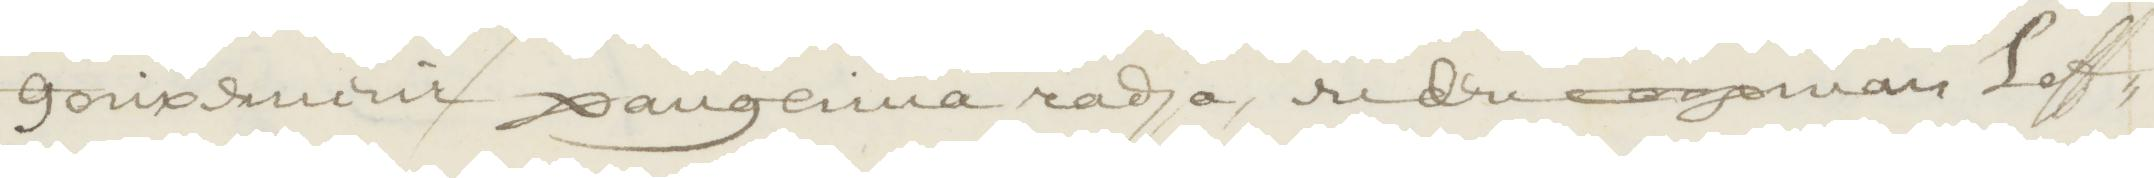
gouverneur panglima radja, en den coopman Loff„
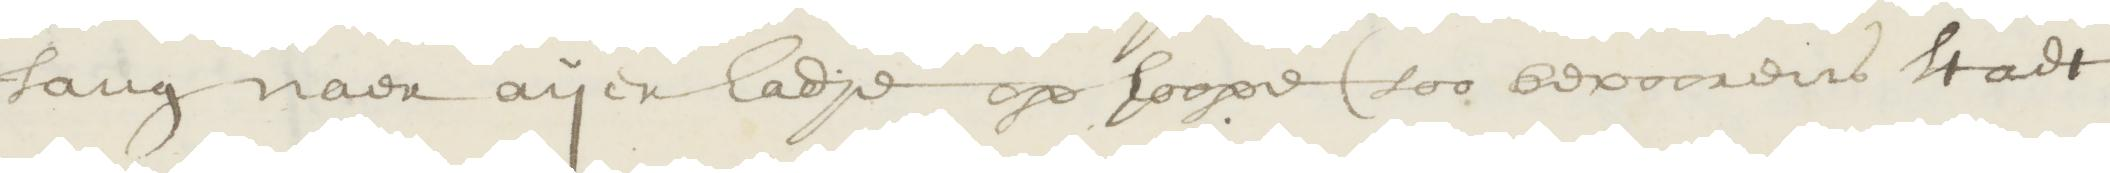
sang naer aijer hadje op hoope (soo bevoorens staet
